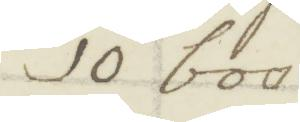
10 bos
